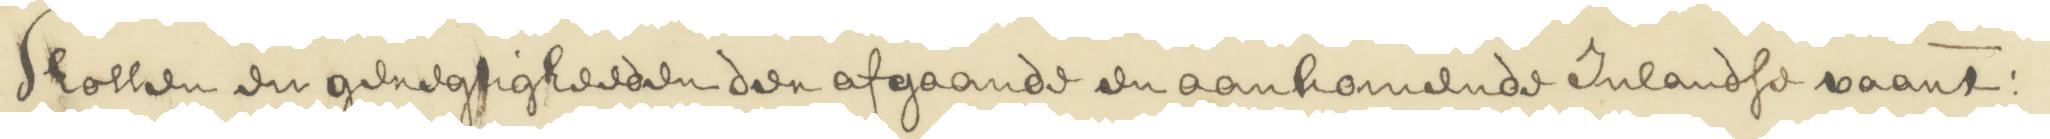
thollen en geregtigheeden der afgaande en aankomende Inlandse vaart:
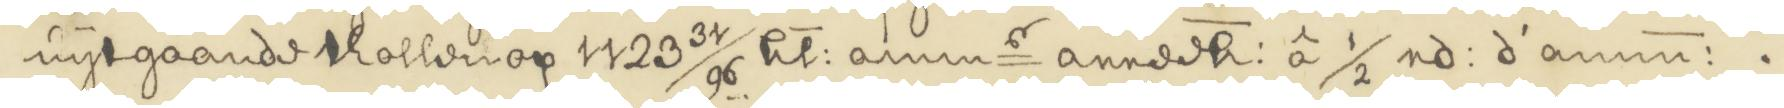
uijtgaande thollen op 1123 31/96 kl: amm=s arreek: â ½ rd: d’amm:
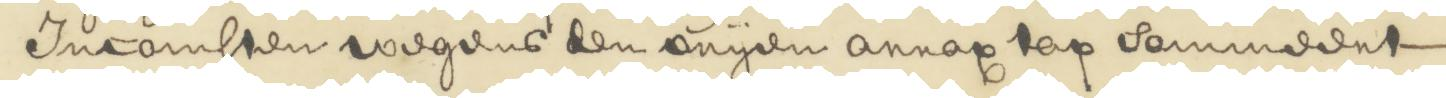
Incomsten wegens den vrijen arrax tap sommeert
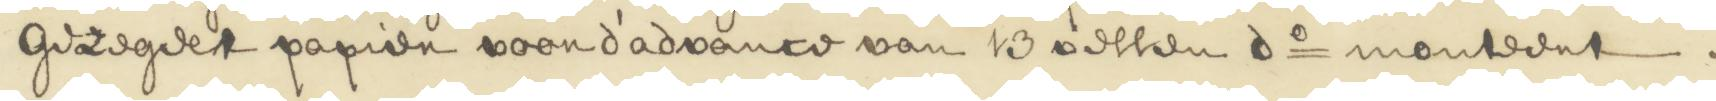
gezegelt papier voor d’advance van 13 vellen d=o monteert
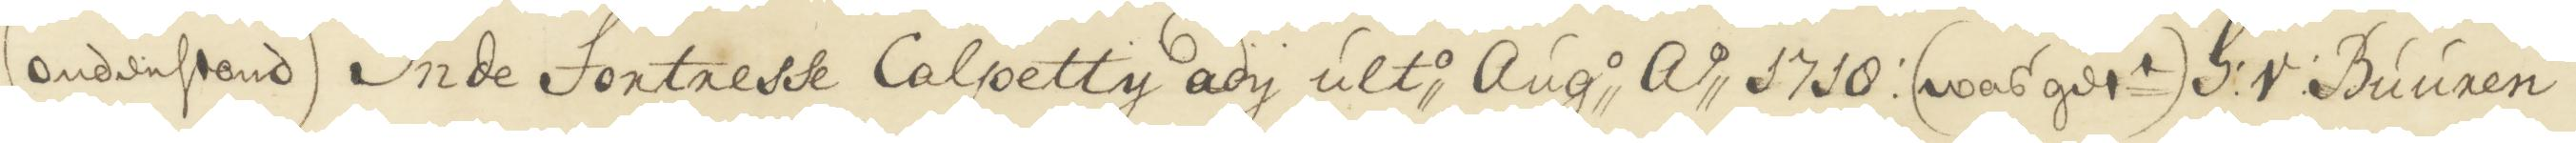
(onderstond) In de fortresse Calpettij adij ult„o Aug„o A„o 1718: (was get=t) H: v: Buuren
